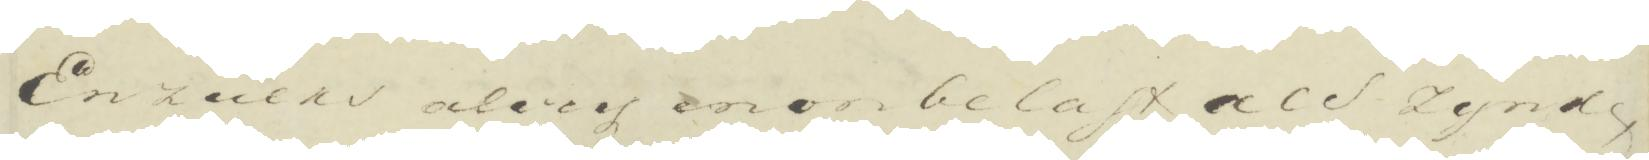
En zulks al vry en onbelast, als zynde
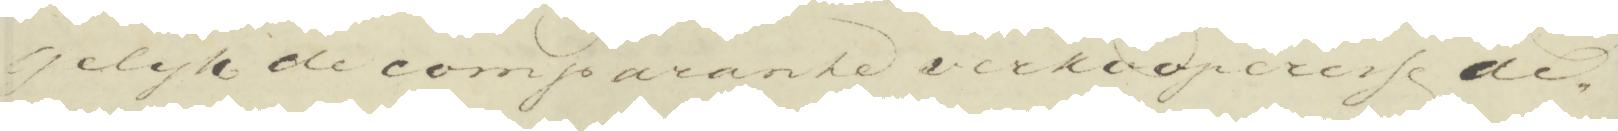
gelyk de comparante verkooperesse de„
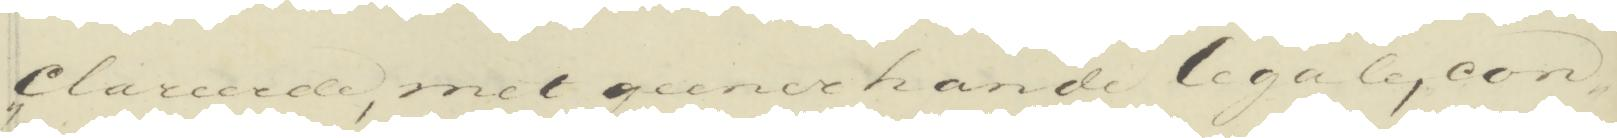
„clareerde, met geenerhande legale con„
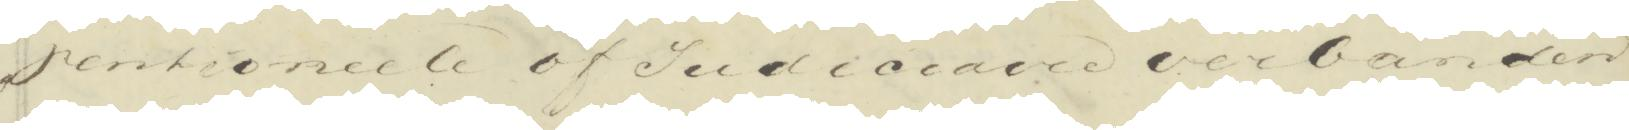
ventioneele of Iudiciaire verbanden
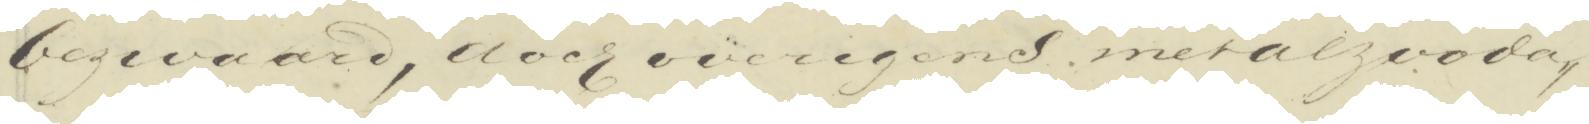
bezwaard, doch overigens met alzooda
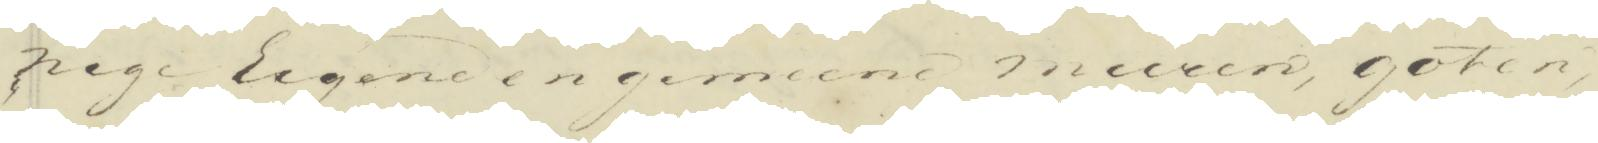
„nige Eigene en gemeene muren, goten,
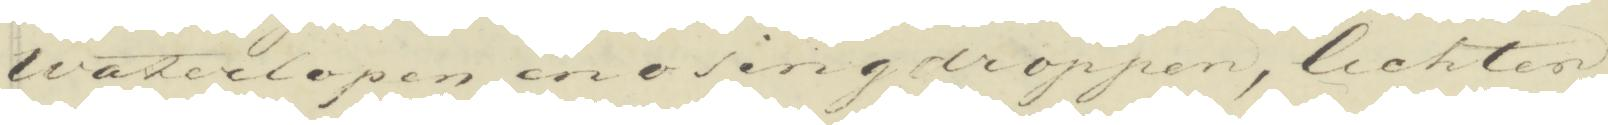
waterlopen en osingdroppen, lichten
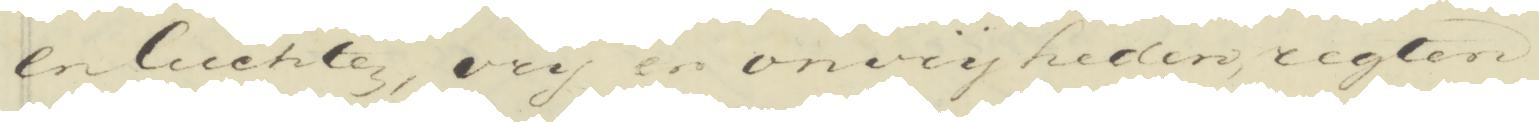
en luchten, vry en onvrijheden, regten
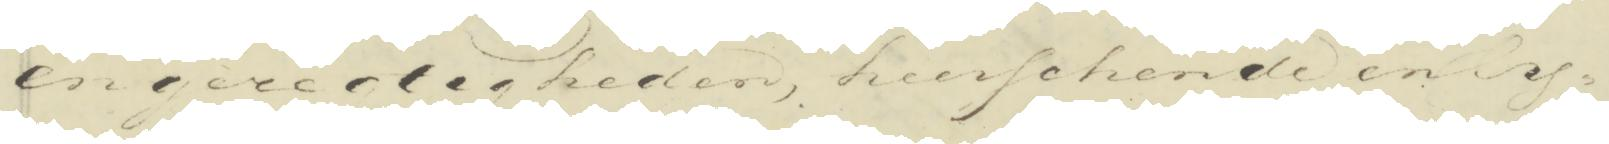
en geregtigheden, heerschende en ly„
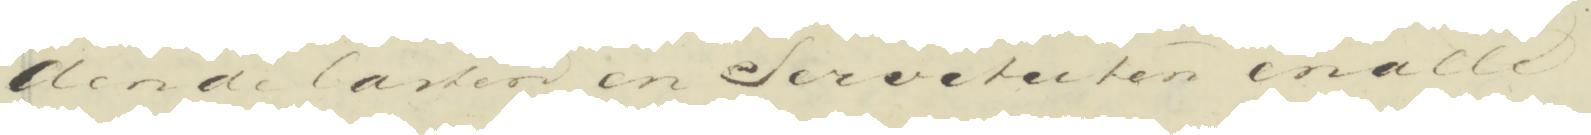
dende lasten en Servituten en alle
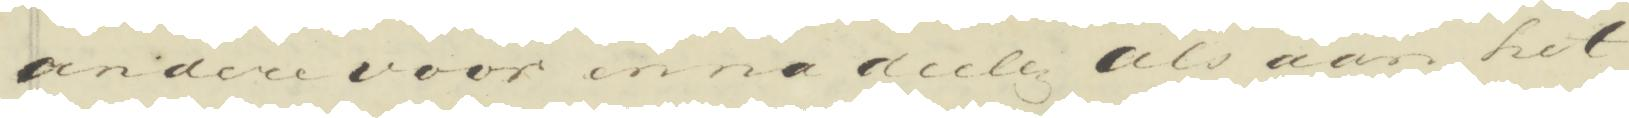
andere voor en na deelen als aan het
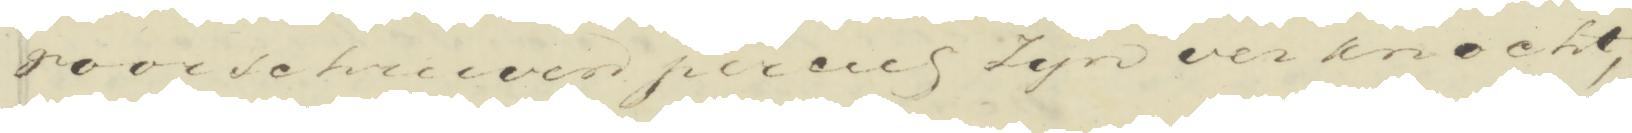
voorschreeven perceel zyn verknocht,
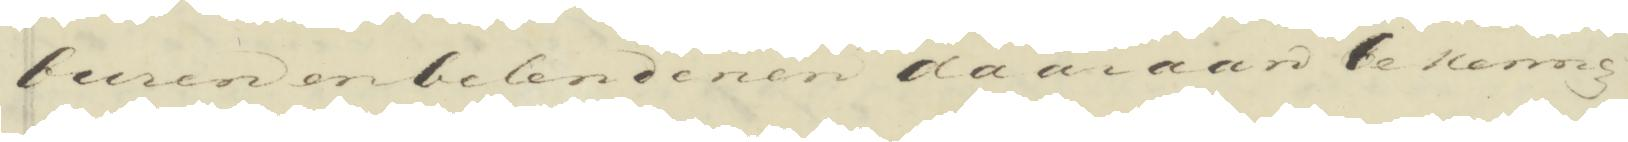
buren en belendenen daaraan bekennen
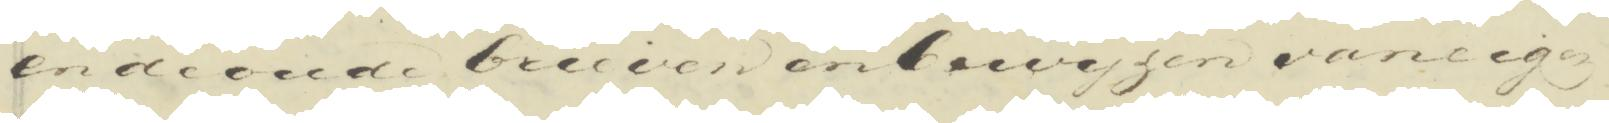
en de oude brieven en bewyzen vaneigen
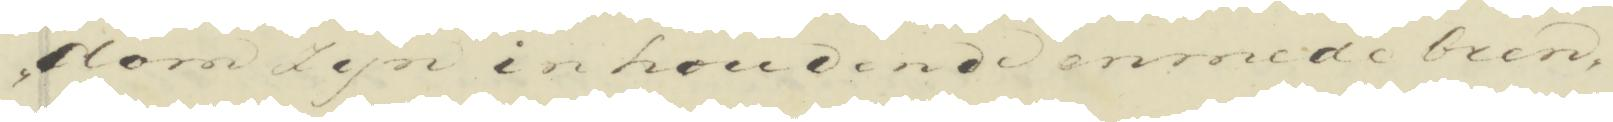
„dom zyn inhoudende enmede bren„
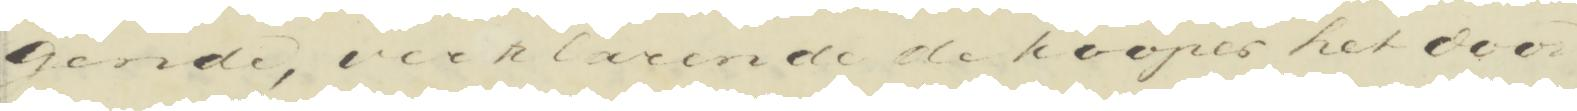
gende, verklarende de kooper het door
